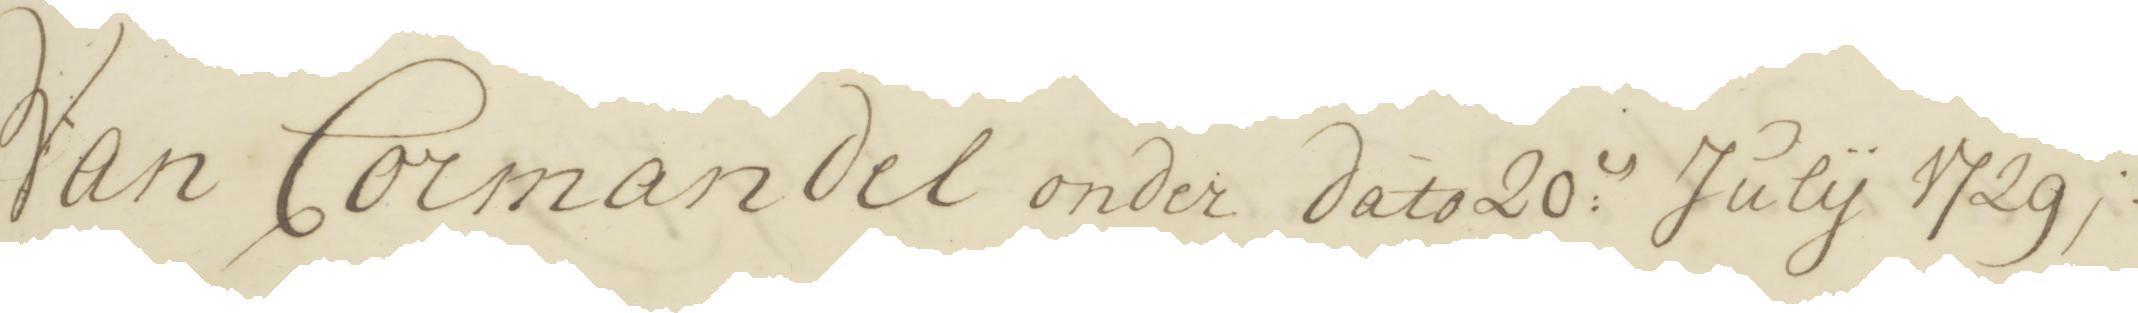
Van Cormandel onder dato 20:e Julij 1729;
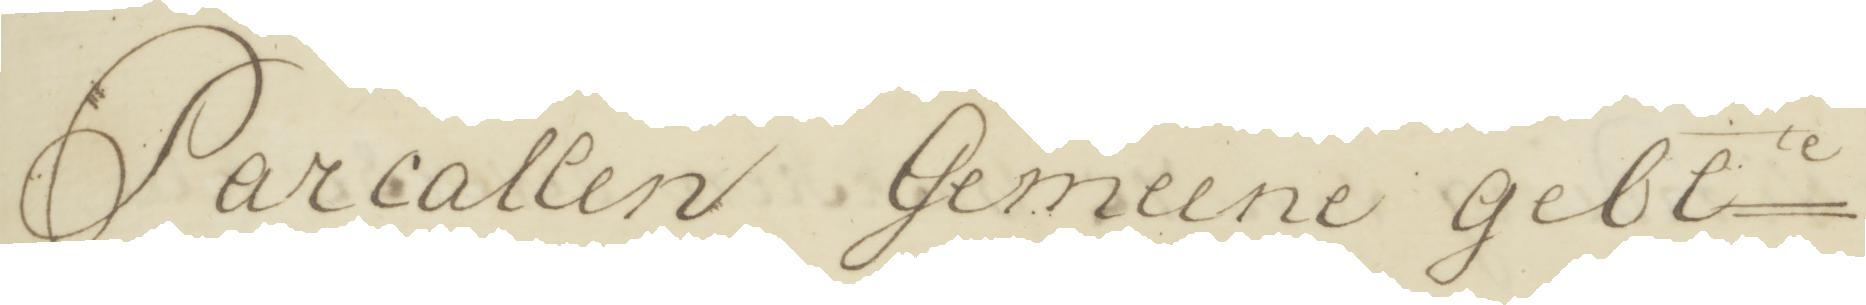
Parcallen Gemeene gebl=te
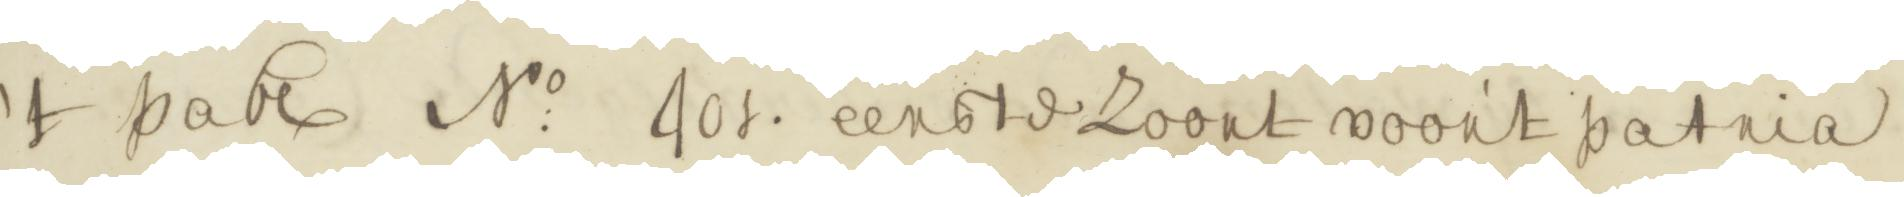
't pak N:o 401. eerste Zoort voor 't patria
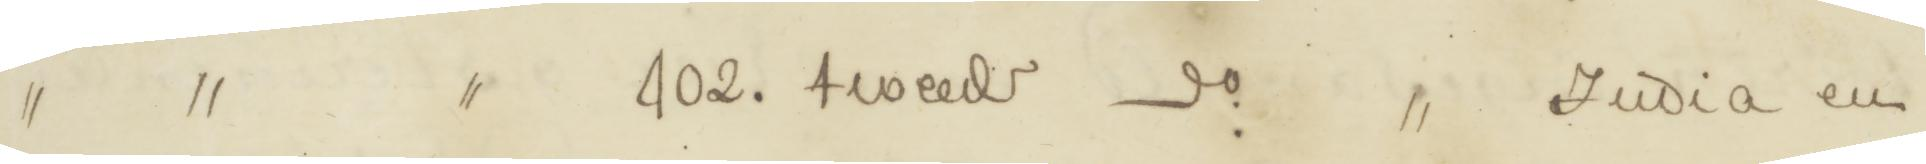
„ „ „ 402. tweede D:o „ India en
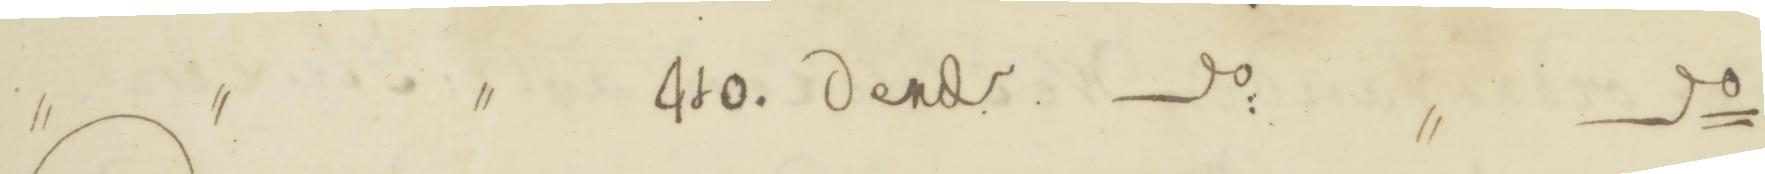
„ „ „ 410. derde D:o „ D=o
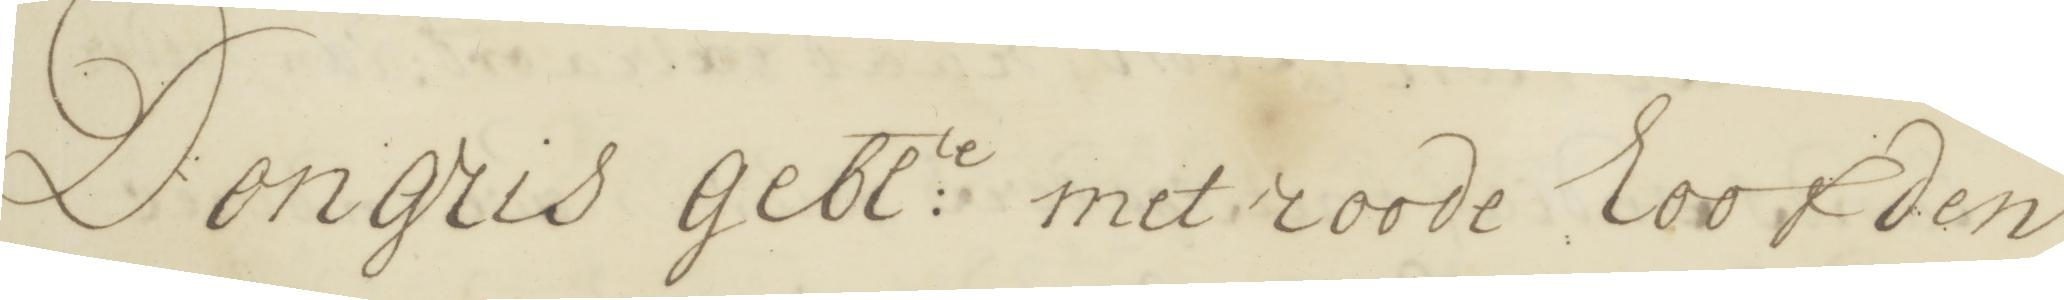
Dongris gebl:te met roode hoofden
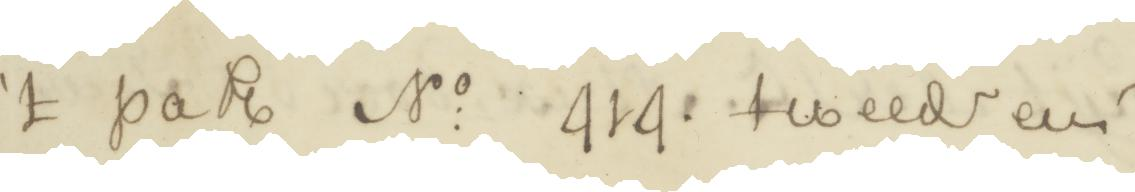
't pak N:o 414. tweede en
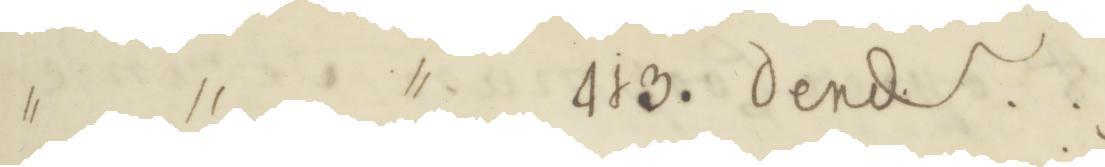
„ „ „ 413. derde . .
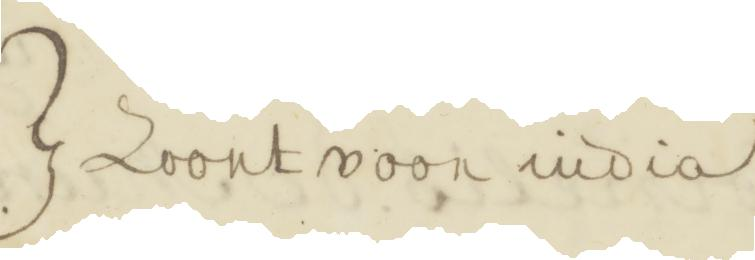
} Zoort voor india
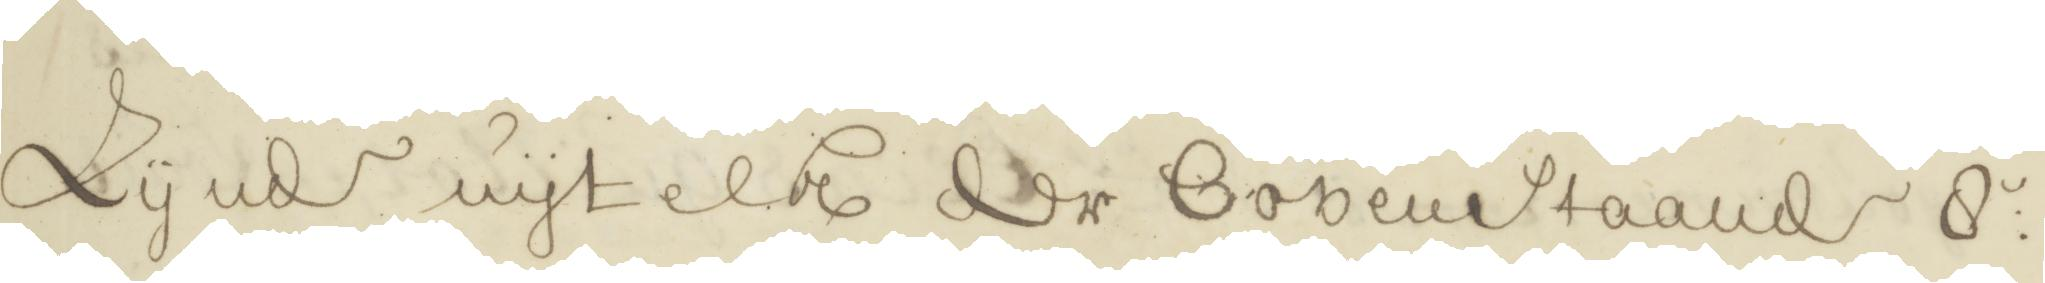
Zijnde uijt elk der bovenstaande 8:'
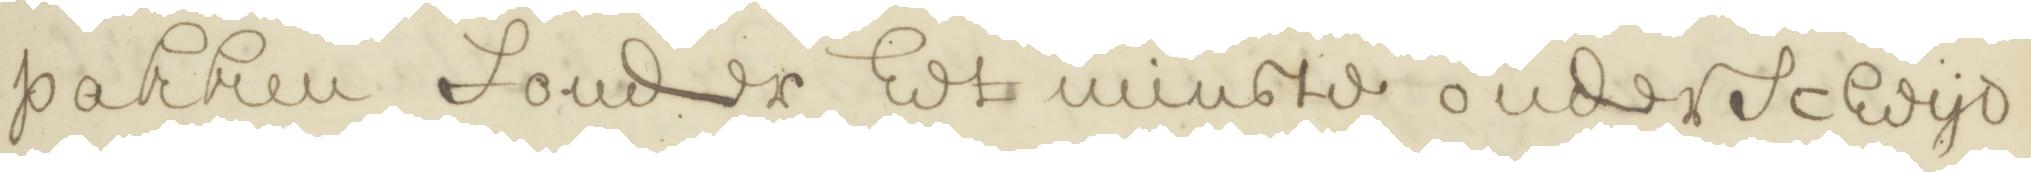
pakken Sonder het minste onderscheijd
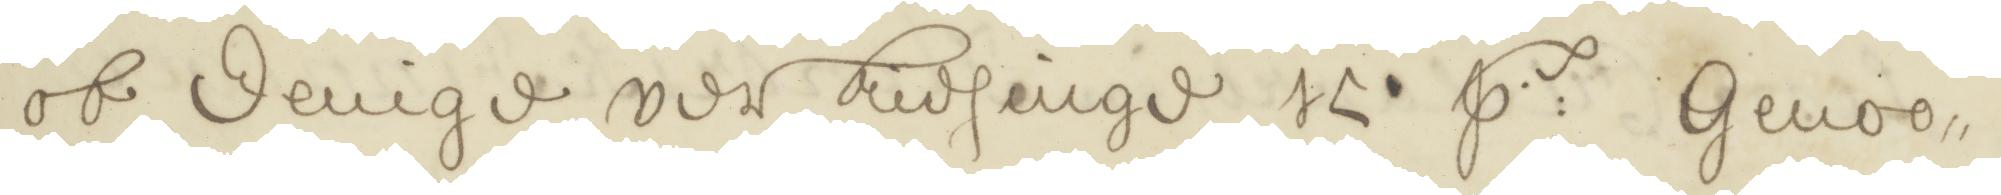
of Eenige verkiesinge 15 p:s genoo„
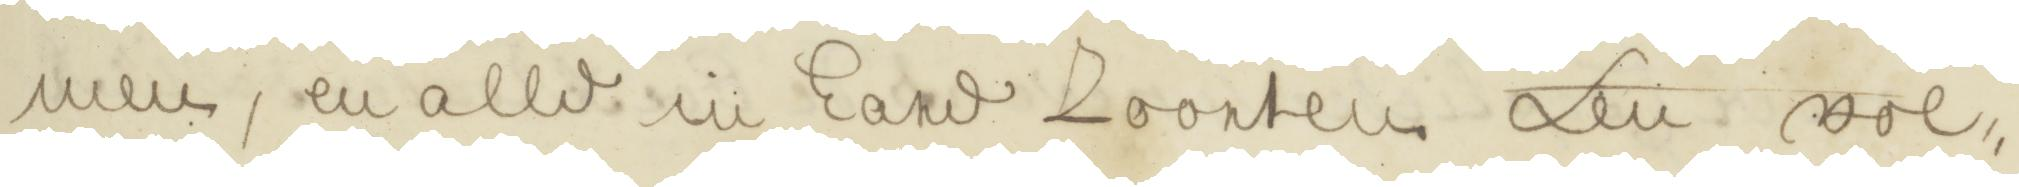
men, en alle in hare Zoorten ten vol„
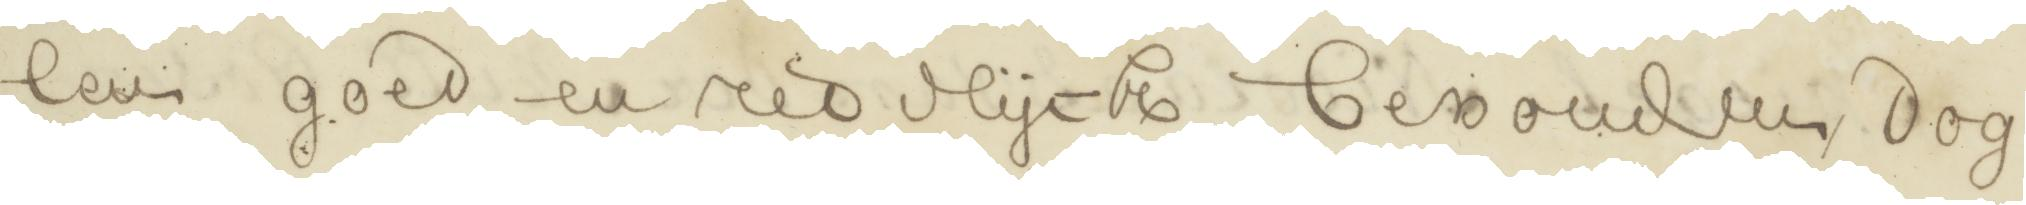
len goed en redelijck bevonden, dog
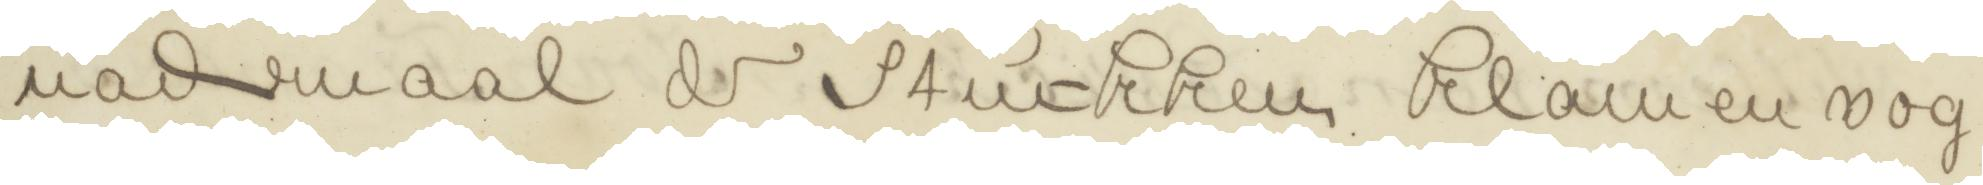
nademaal de stuckken klam en vog
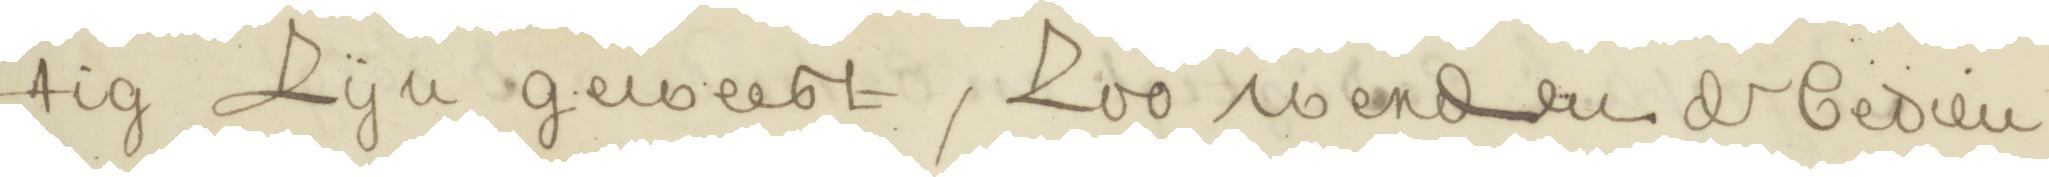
tig Zijn geweest, Zoo werden de bedien
